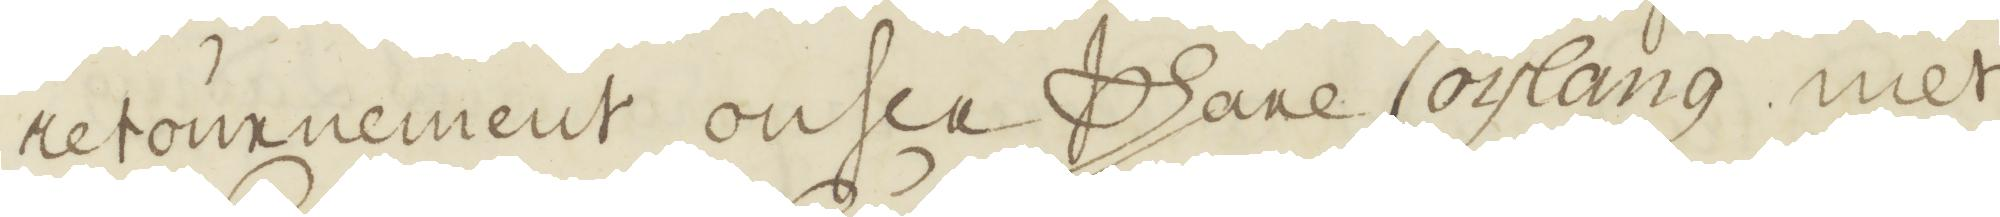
retournement onser Phare Coijlang met
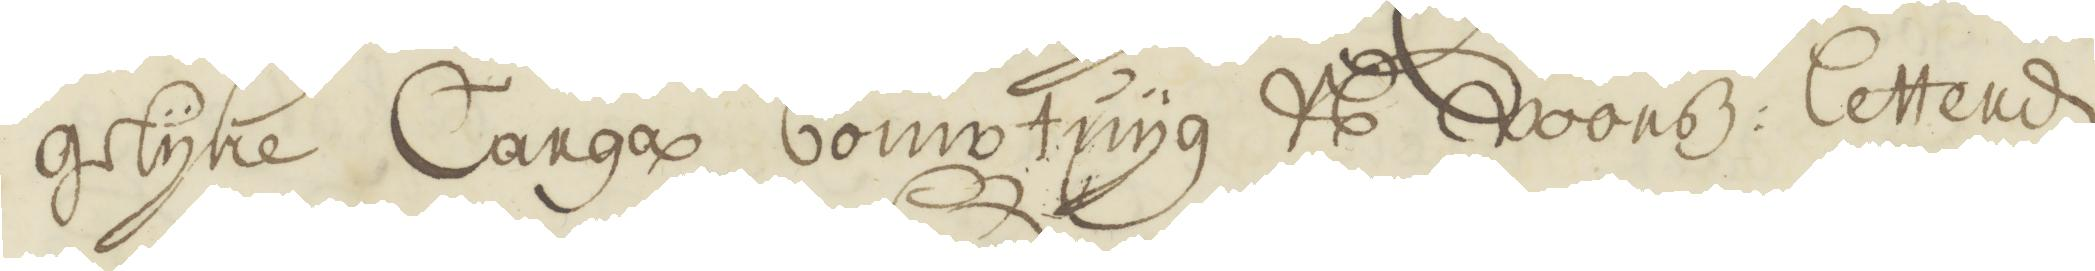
gelijke Carga bouwtuijg VE voorsz: letteren
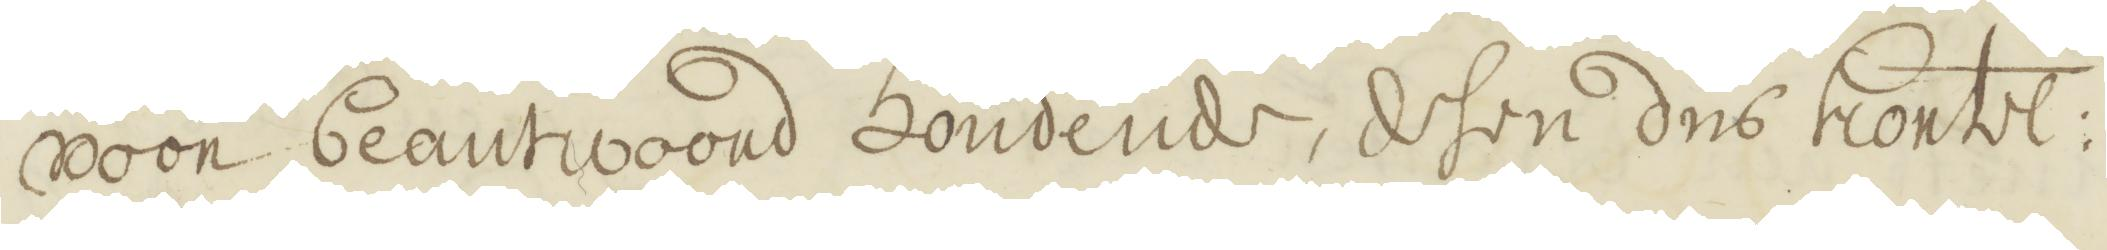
voor beantwoord houdende, desen dus kortel:
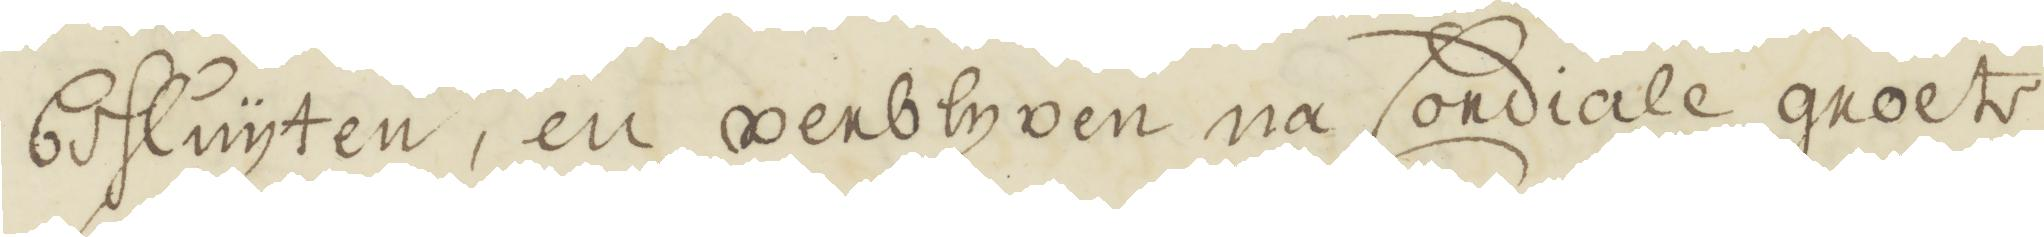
besluijten, en verblyven na Cordiale groete
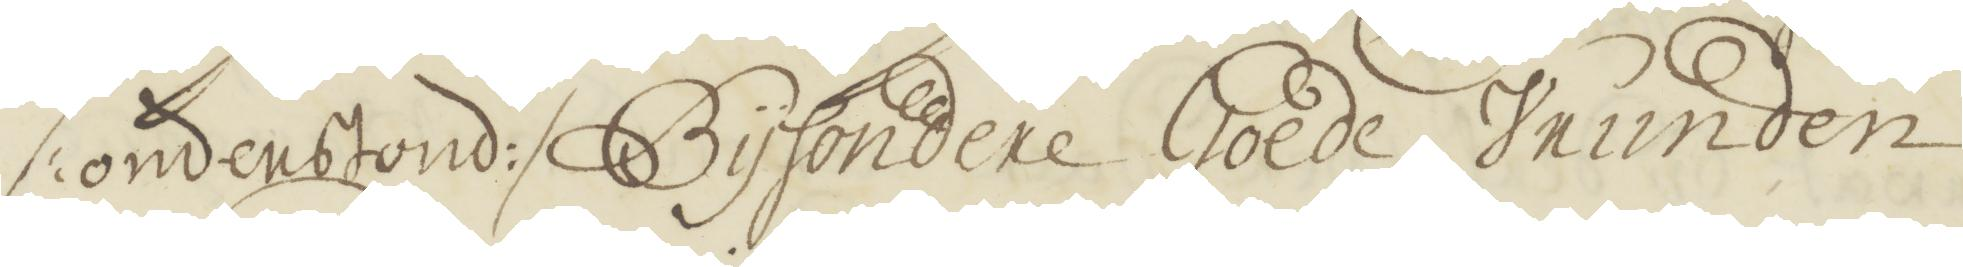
/: onderstond:/ Bijsondere Goede Vrunden
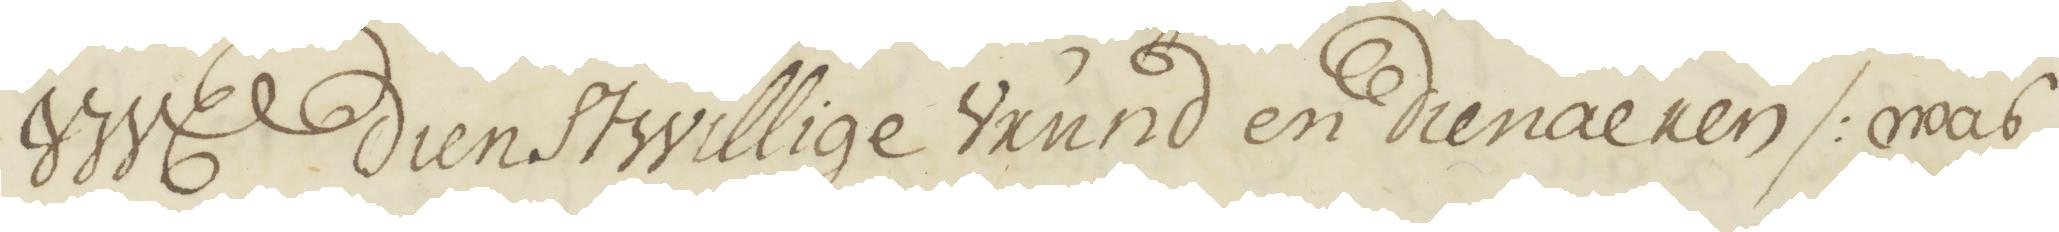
VWE dienstwillige Vrund en dienaeren /:was
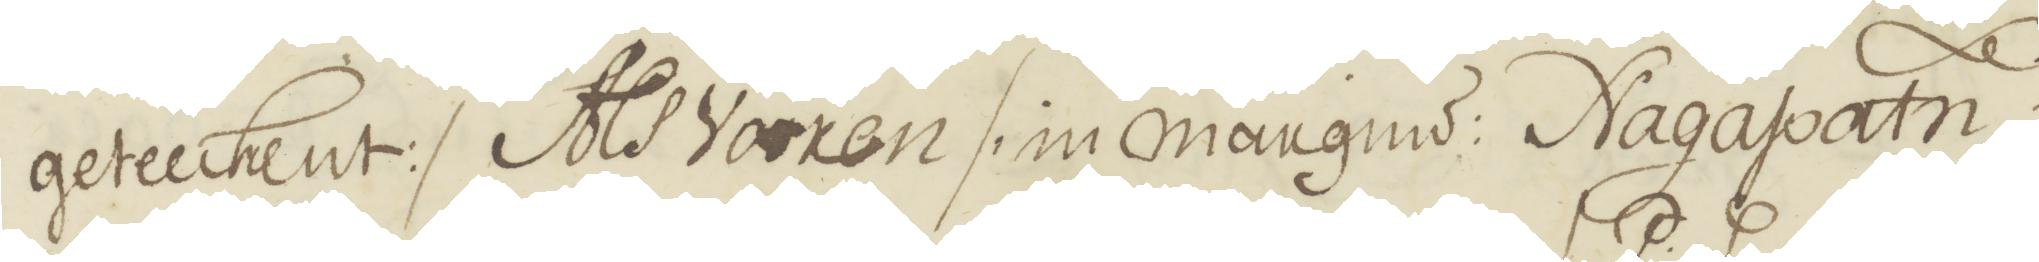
geteeckent:/ Als Vooren /. in margine: Nagapatn:
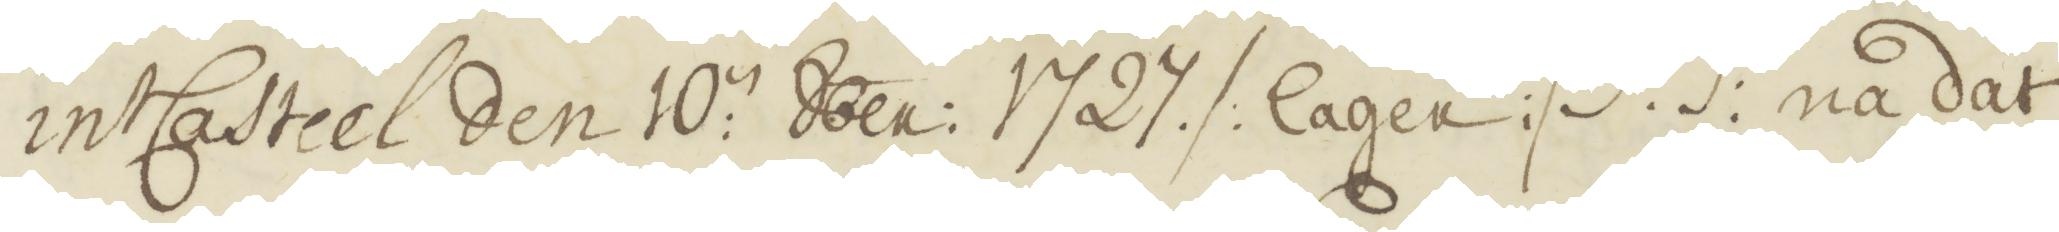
in:t Casteel den 10:e 8ber: 1727. /:lager:/ P: S: na dat
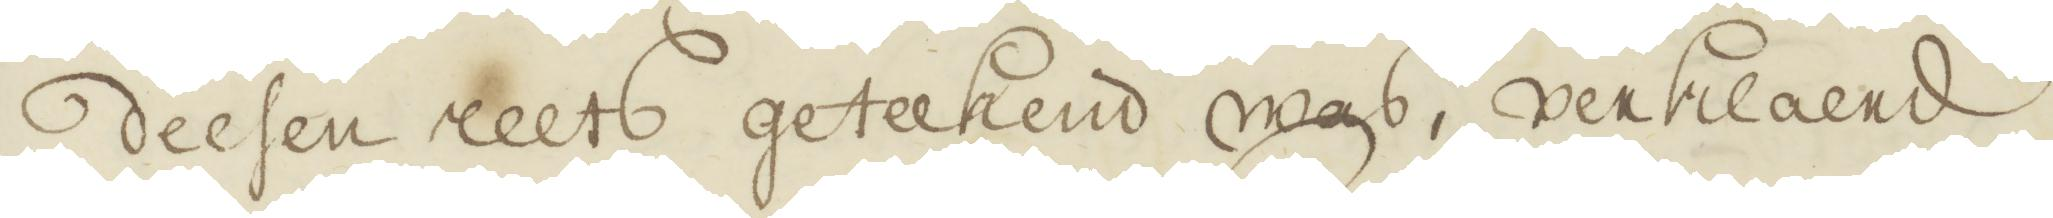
deesen reets geteekend was, verklaerde
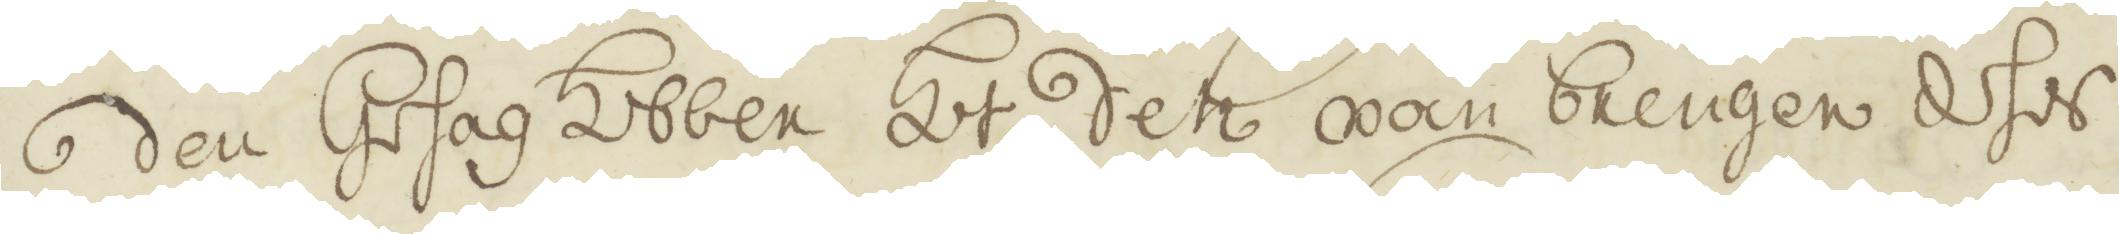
den Gesag hebber het dek van brenger deses
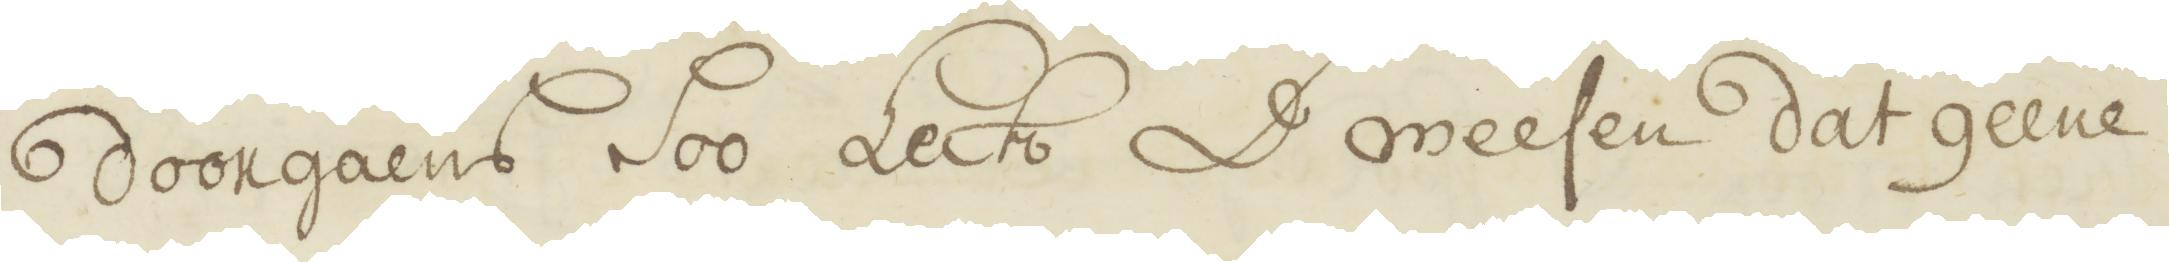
doorgaens Soo Leck te weesen dat geene
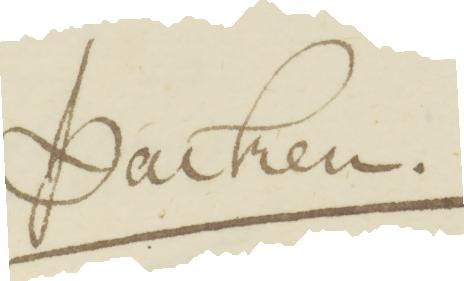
Packen.
